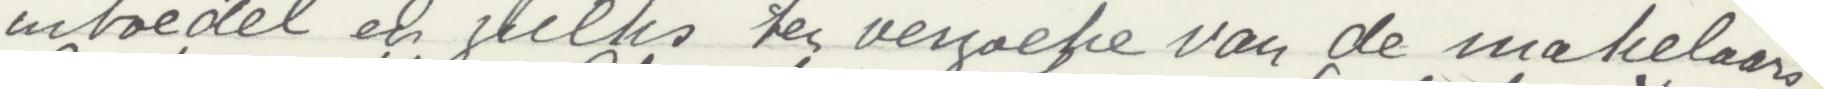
inboedel en zulks ten versoeke van de makelaars
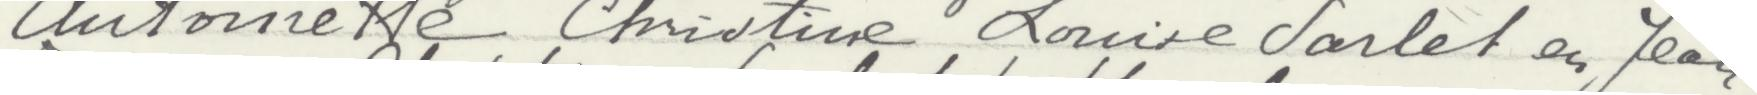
Antoinette Christine Louise Sarlet en Jean
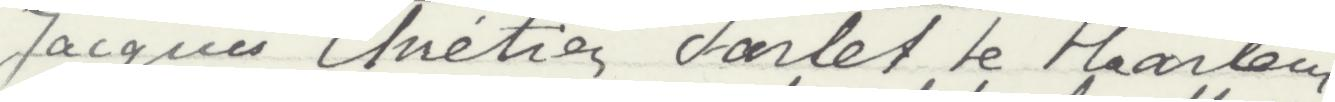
Jacques Chrétien Sarlet te Haarlem
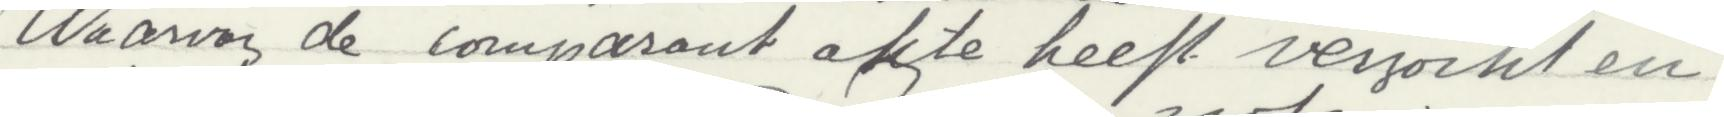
Waarvan de comparant akte heeft verzocht en
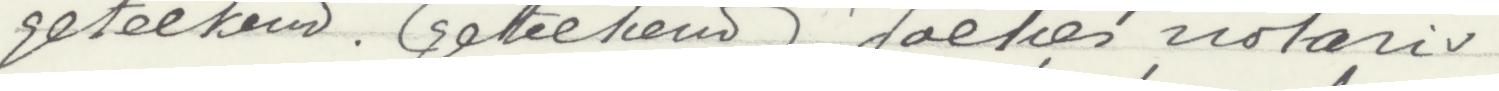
geteekend. (geteekend) Joekes notaris
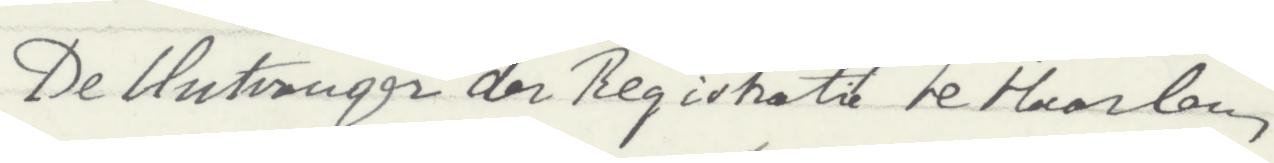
De Ontvanger der Registratie te Haarlem
